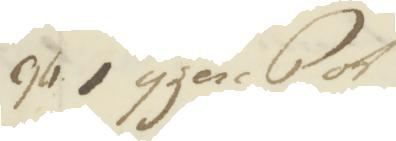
94.1 ysere Pot
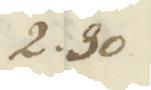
2.30
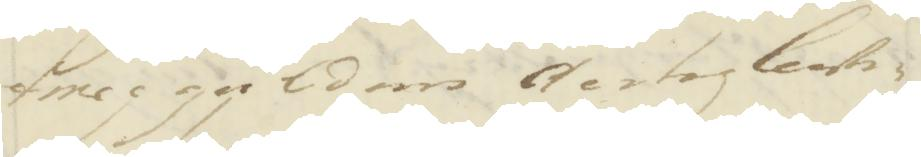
twee guldens dertig Cent
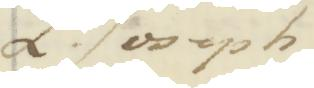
L. Joseph
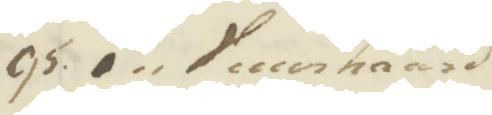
95: 1 „ Vuurhaard
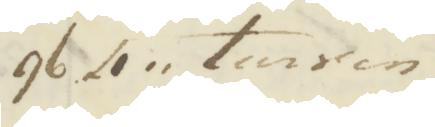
96.4 „ turven
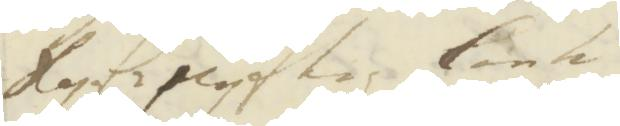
Vyfenvyftig Cent
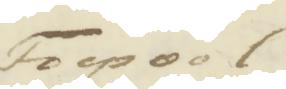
Toepool
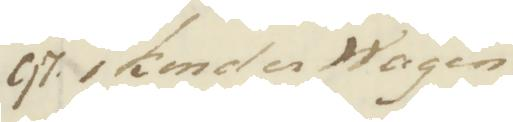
97 1 Kinder Wagen
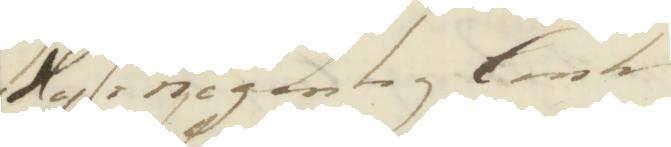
Vyfennegentig Cent
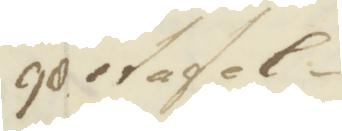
98 1 tafel-
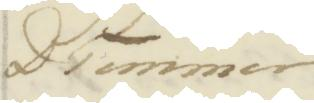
D Timmer
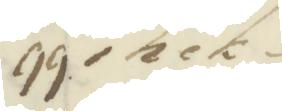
99 1 hek
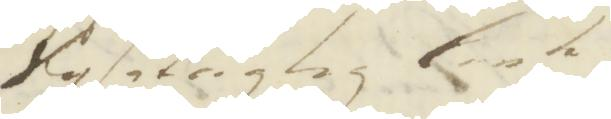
Vyfentagtig Cent
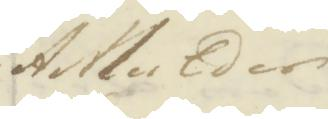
A Mulder
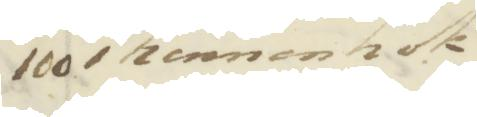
100 1 hennenhok
